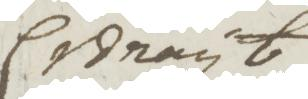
{ 1 draijb
